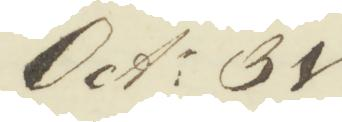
Oct:r 31
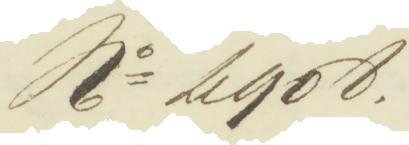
N=o 4908.
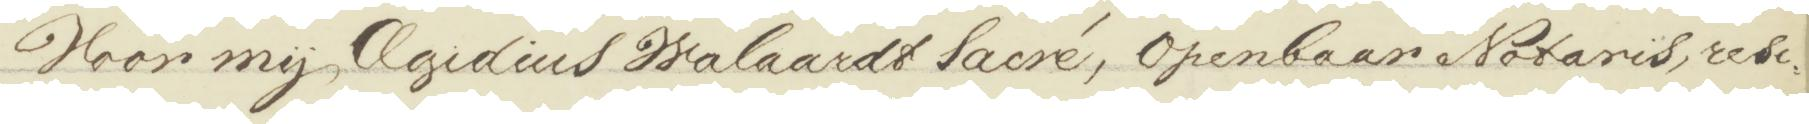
Voor mij AEgidius Walaardt Sacré, Openbaar Notaris, resi
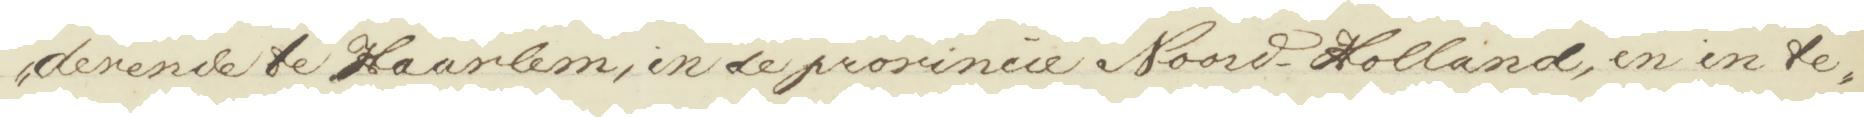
„derende te Haarlem, in de provincie Noord-Holland, en in te„
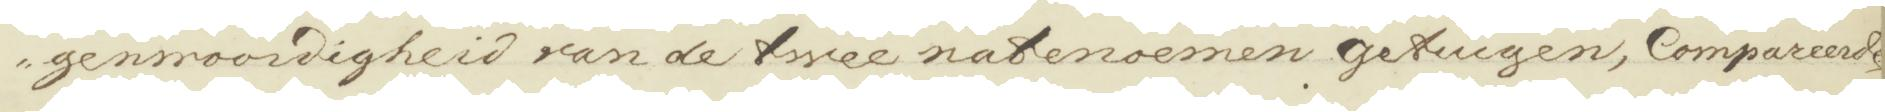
„genwoordigheid van de twee natenoemen getuigen, Compareerde
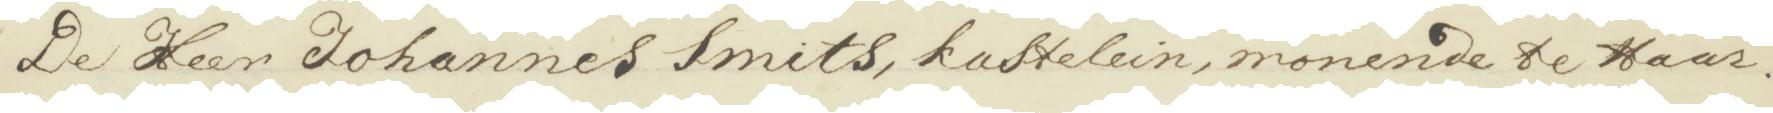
De Heer Johannes Smits, kastelein, wonende te Haar
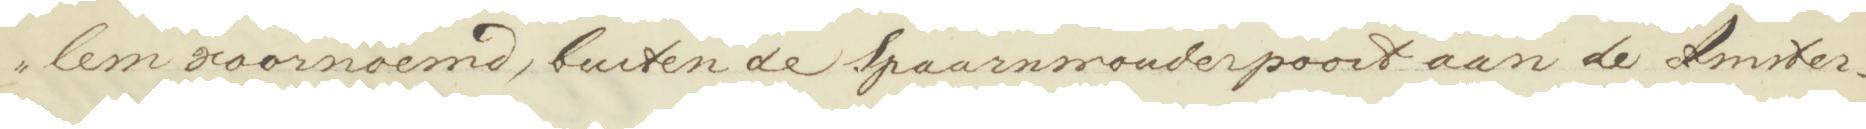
„lem voornoemd, buiten de Spaarnwouderpoort aan de Amster
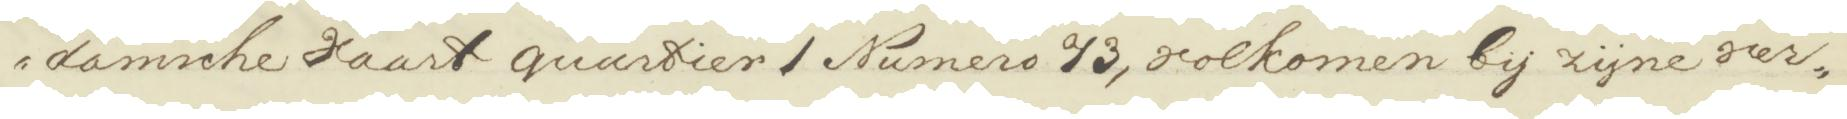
„damsche vaart quartier 1 Numero 73, volkomen bij zijne ver„
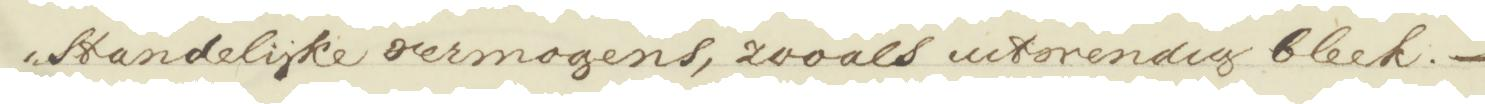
„standelijke vermogens, zooals uitwendig bleek.
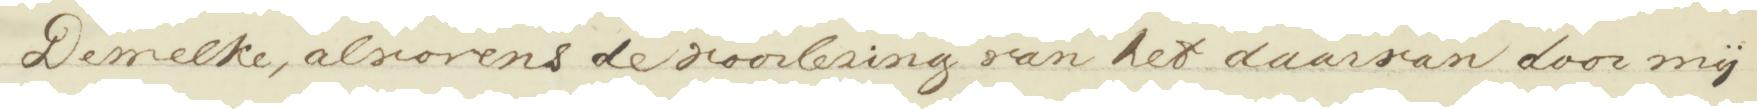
Dewelke, alvorens de voorlezing van het daarvan door mij
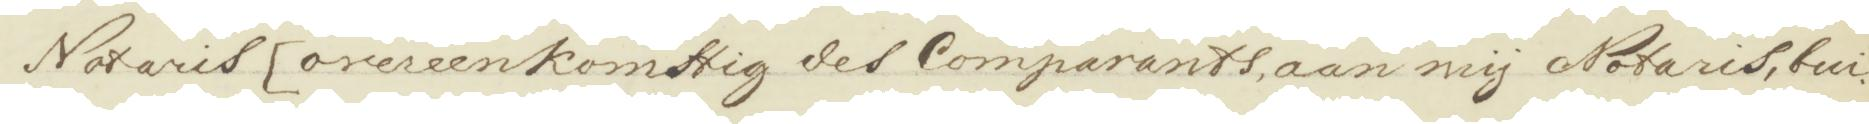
Notaris [overeenkomstig des Comparants, aan mij Notaris, bui
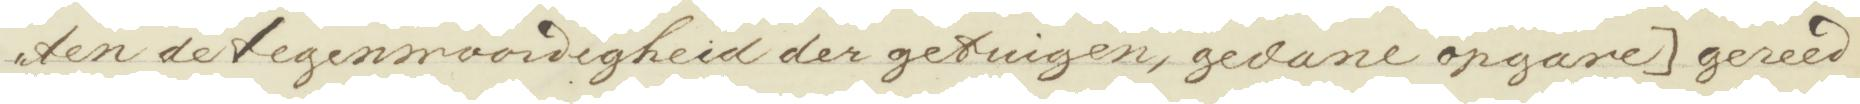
„ten de tegenwoordigheid der getuigen, gedane opgave] gereed
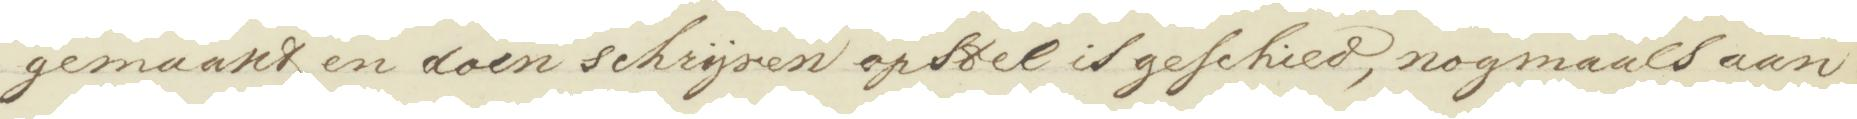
gemaakt en doen schrijven opstel is geschied, nogmaals aan
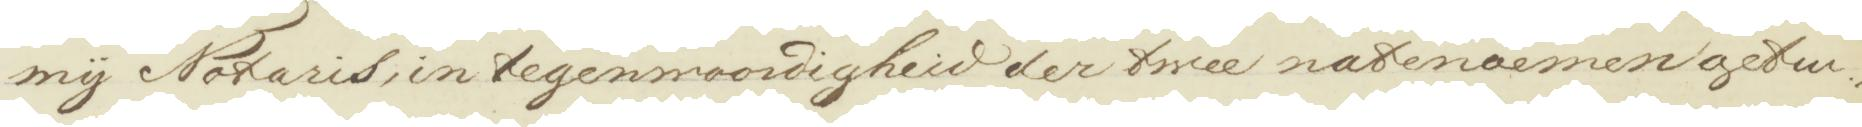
mij Notaris, in tegenwoordigheid der twee natenoemen getui
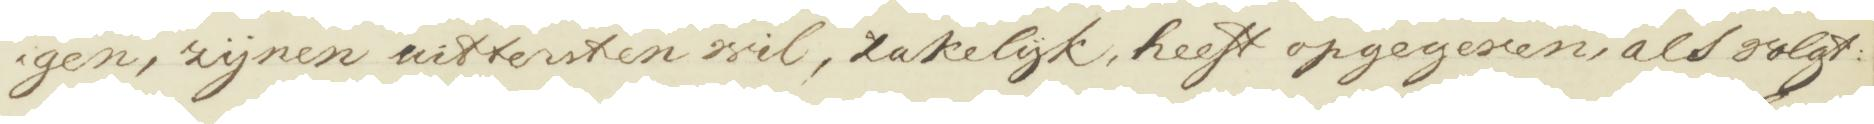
gen, zijnen uittersten wil, zakelijk, heeft opgegeven, als volgt:
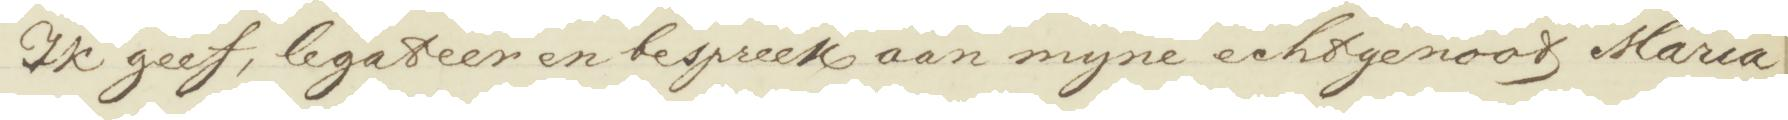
Ik geef, legateer en bespreek aan myne echtgenoot Maria
